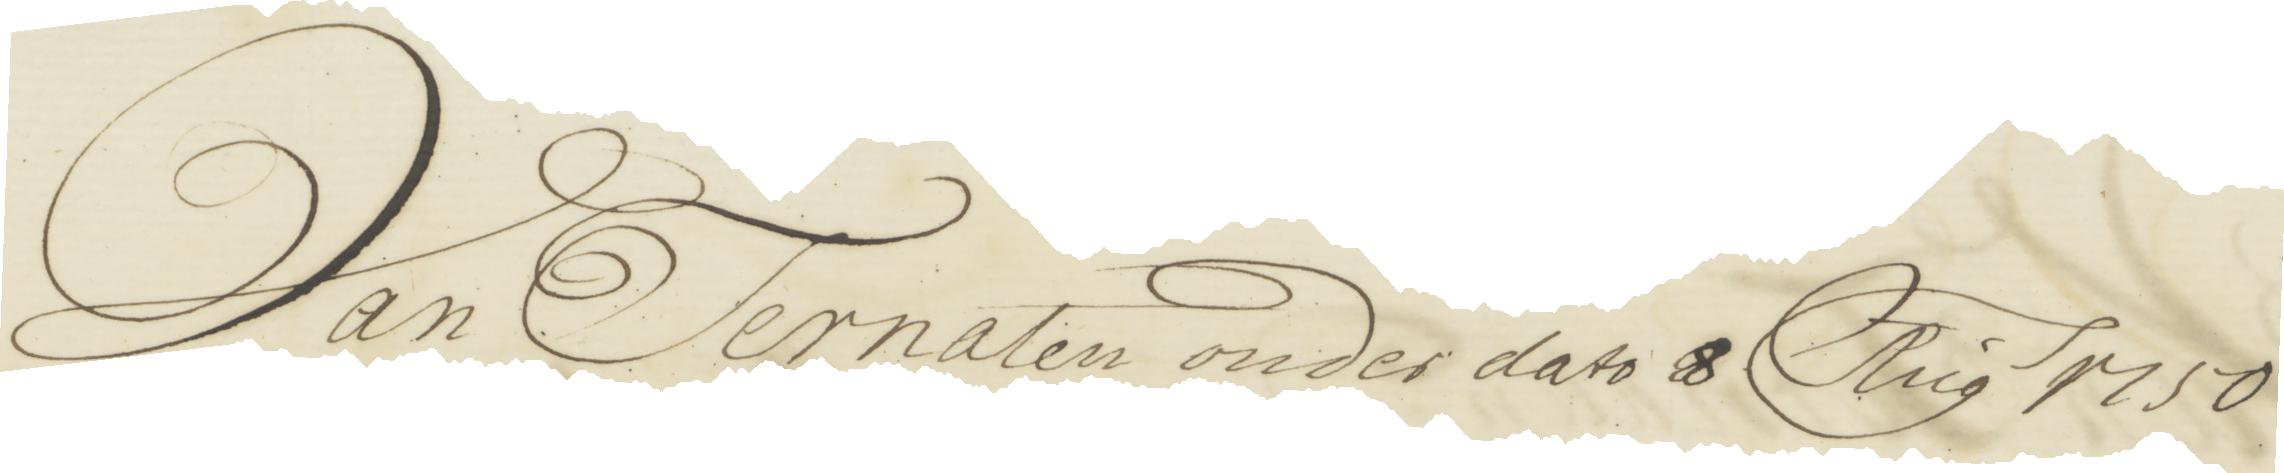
Van Ternaten onder dato 8 Augs 1750
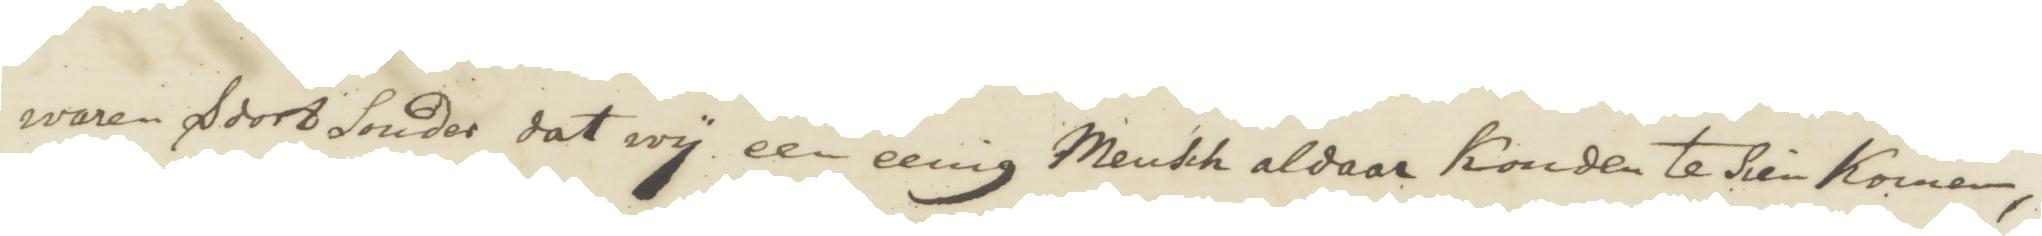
waren verdort sonder dat wij een eenig Mensch aldaar konden te sien komen,
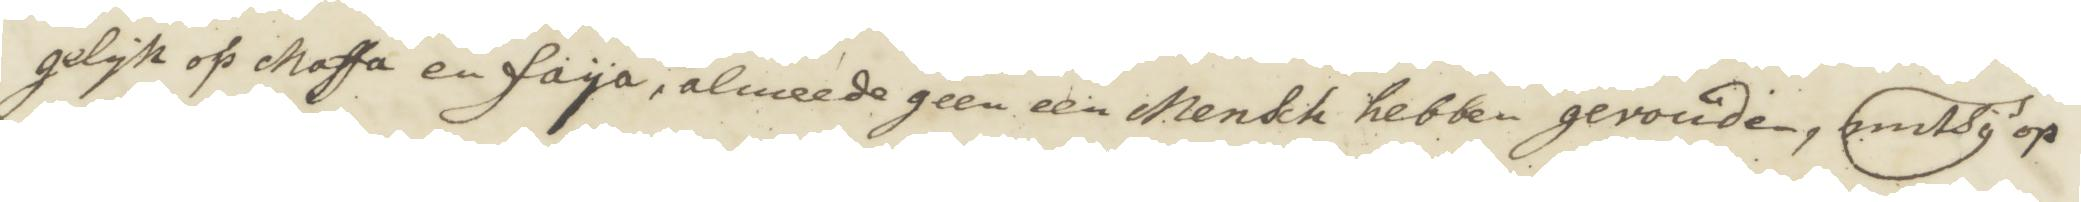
gelijk op Maffa en faija, almeede geen een Mensch hebben gevonden, mitsgs op
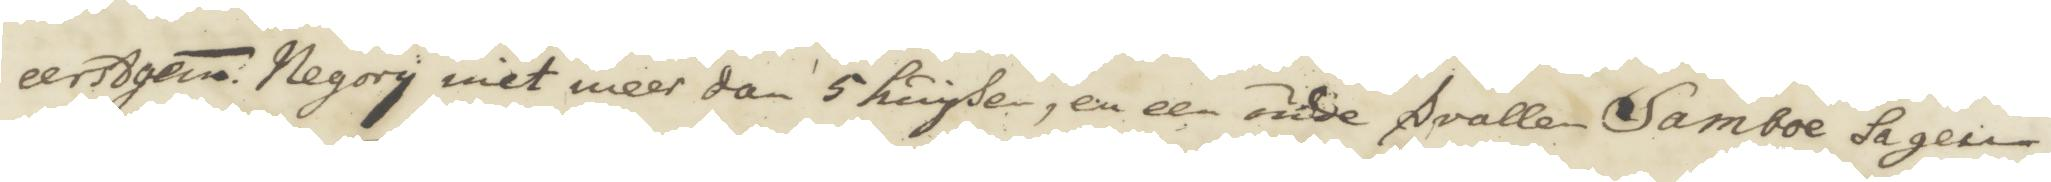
eerstgem: Negorij niet meer dan 5 huijsen, en een oude vervallen Samboe sagen
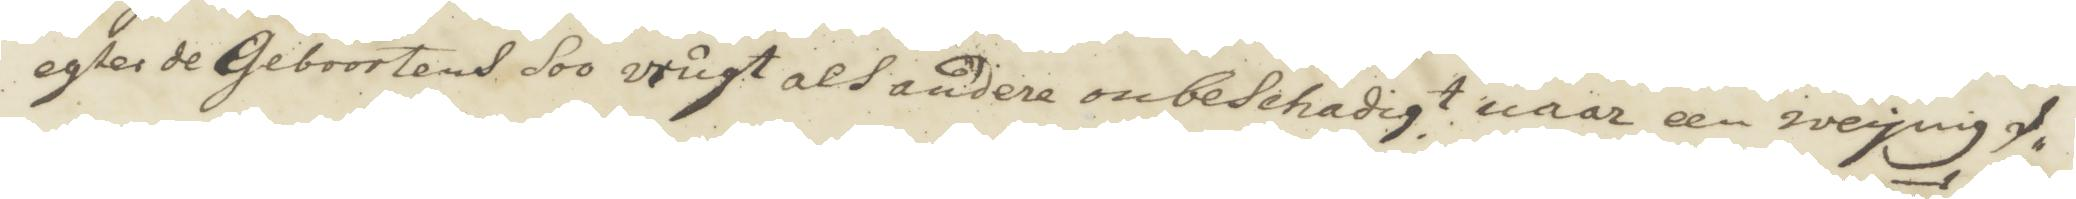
egter de geboortens soo vrugt als andere onbeschadigt naar een weijnig ver„
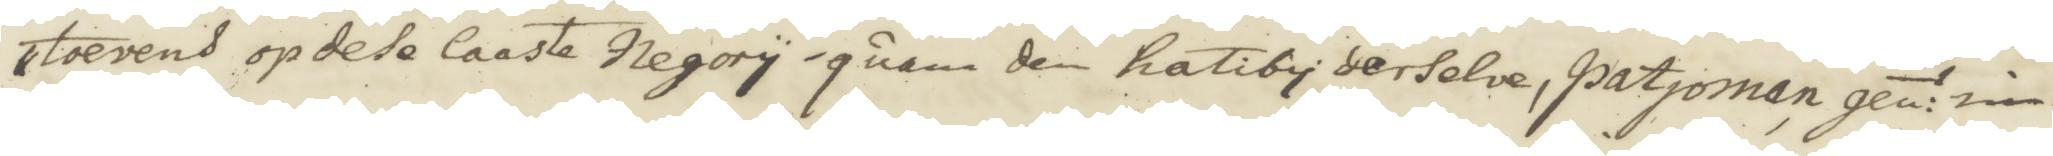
„toevens op dese laaste negorij quam den hatibij derselve, patjomen gen:t in
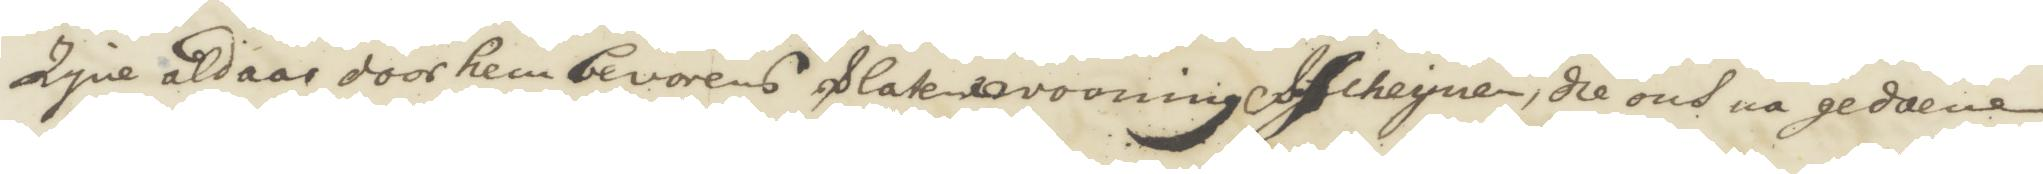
zijne aldaar door hem bevorens verlatene wooning verscheijnen, die ons na gedaene
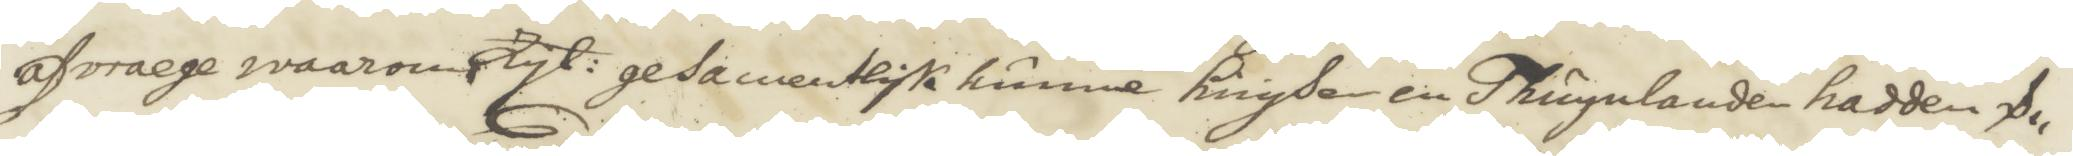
afvraege waaroms zijl: gesamentlijk kunne huijsen en Thuijnlanden hadden ver„
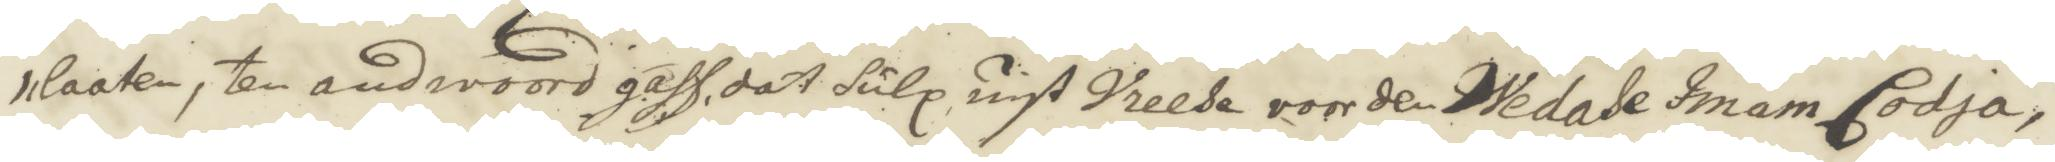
„laaten, ten andwoord gaff, dat sulx uijt vreese voor den Wedase Imam Codja,
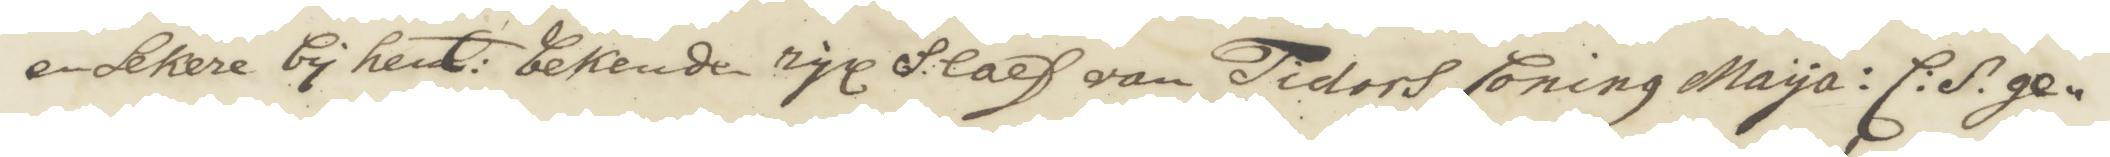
en sekere bij henl: bekende rijx slaef van Tidors Coning Maija: C: S. ge„
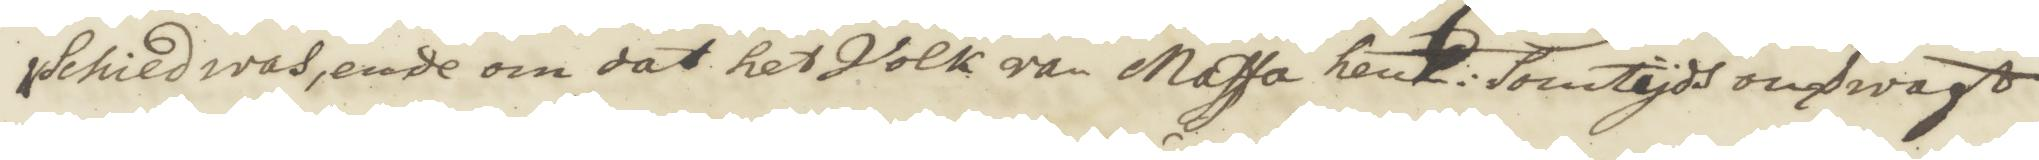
„schied was, ende om dat het Volk van Maffa henl: somtijds onverwagt
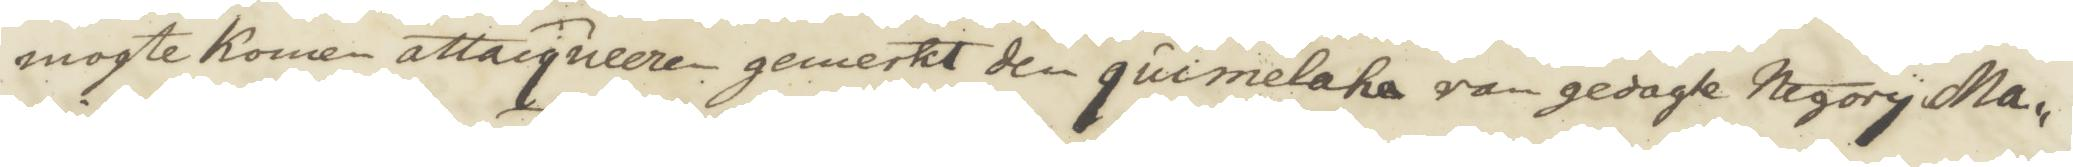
mogte komen attacqueeren gemerkt den quimelaha van gedagte negorij Ma„
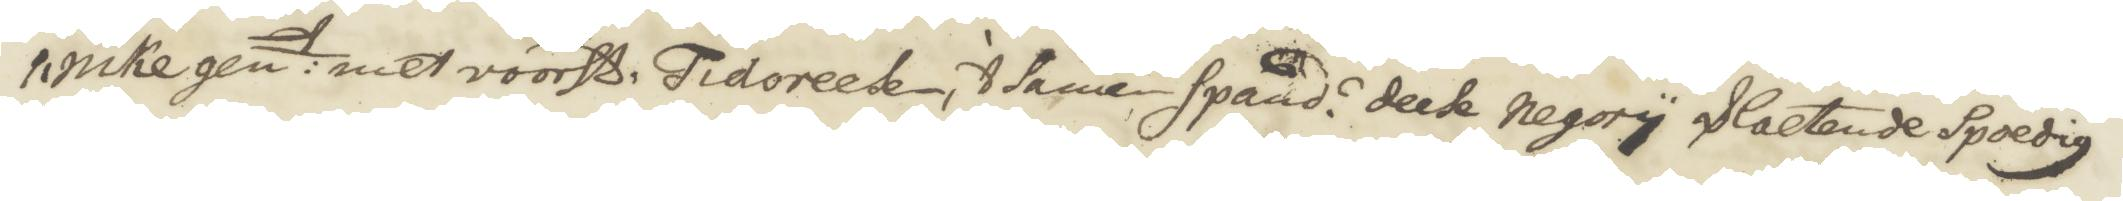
„nike gen:t met voorsz: Tidoreese, 't samen spand. deese negorij verlaetende spoedig
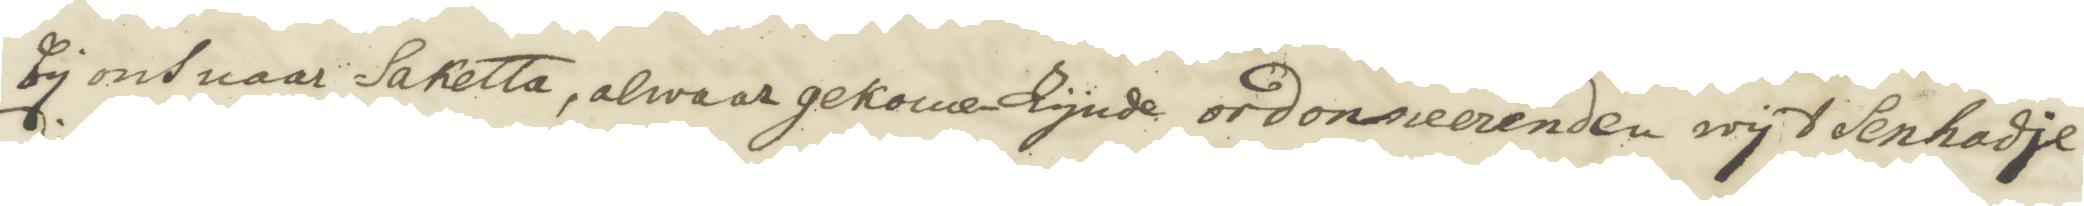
bij ons naar saketta, alwaar gekomen zijnde ordonneerenden wij t senhadje
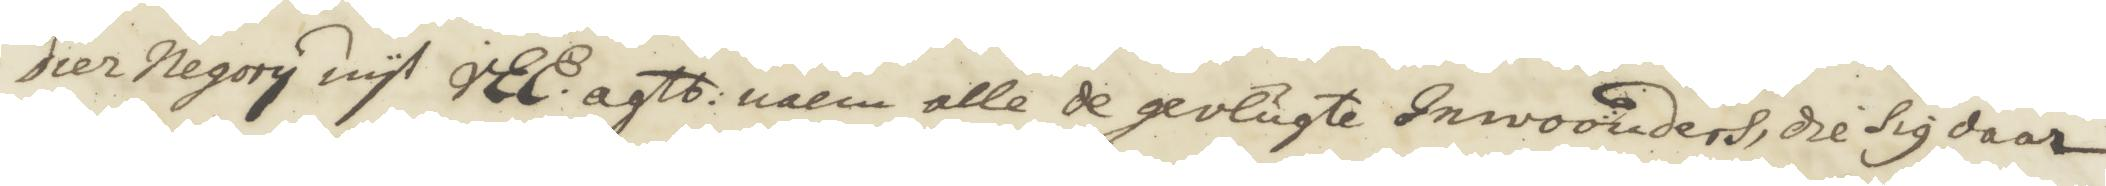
dier negorij uijt VEE: agtb: naem alle de gevlugte Inwoonders, die sig daar
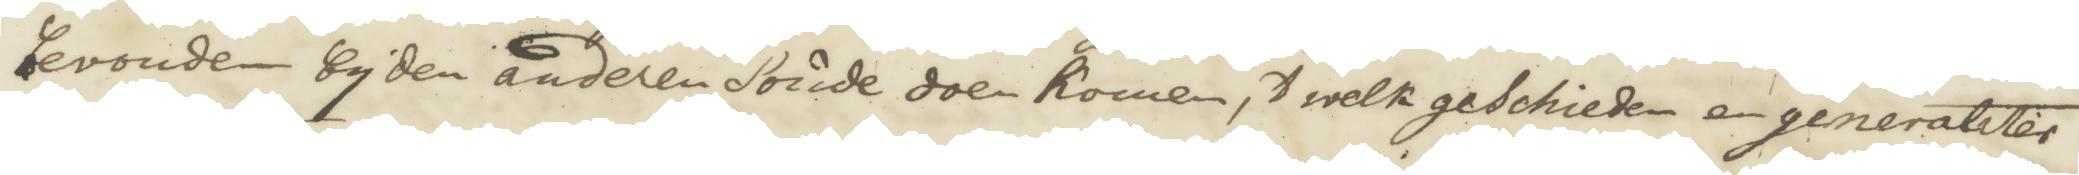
bevonden bij den anderen soude doen komen, 't welk geschieden en generaliter
